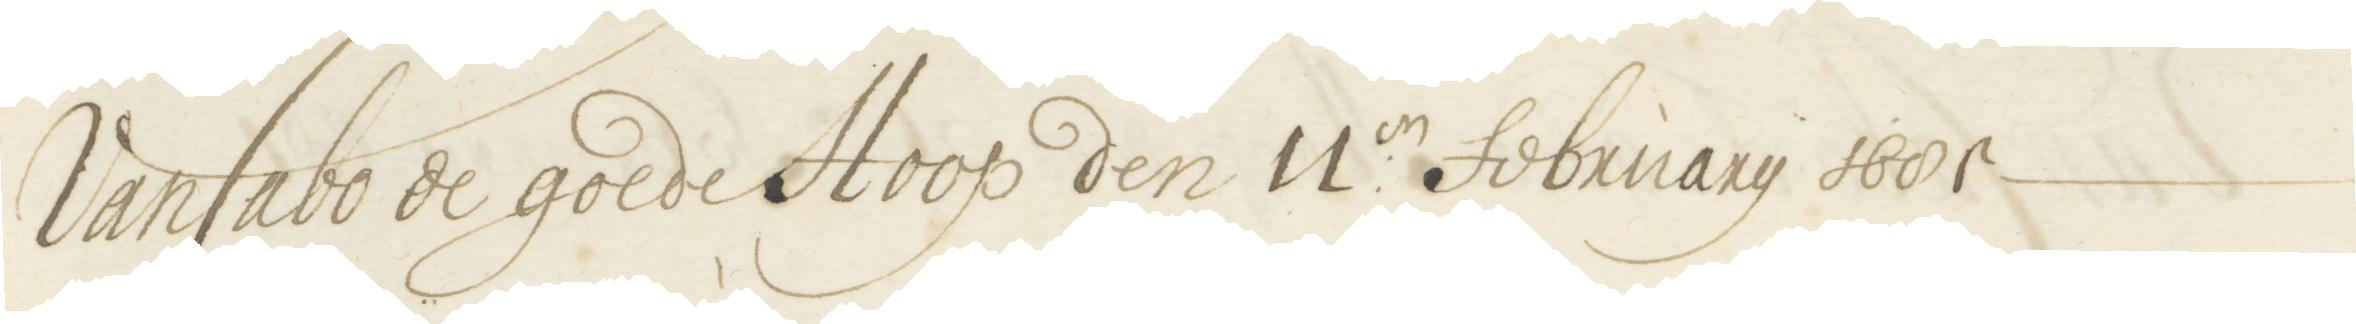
Van Cabo de goede Hoop den 11:en februarij 1685 —
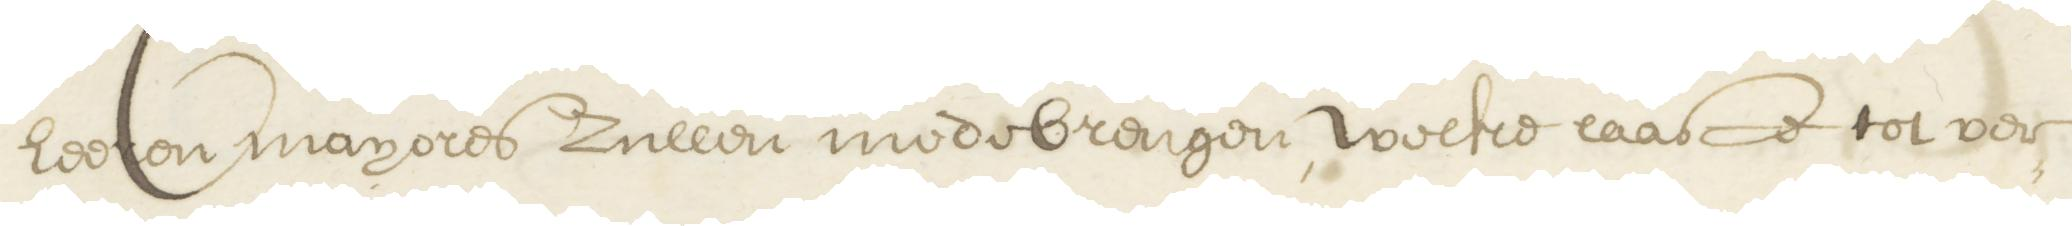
heeren maijores zullen medebrengen, welke laaste tot ver„
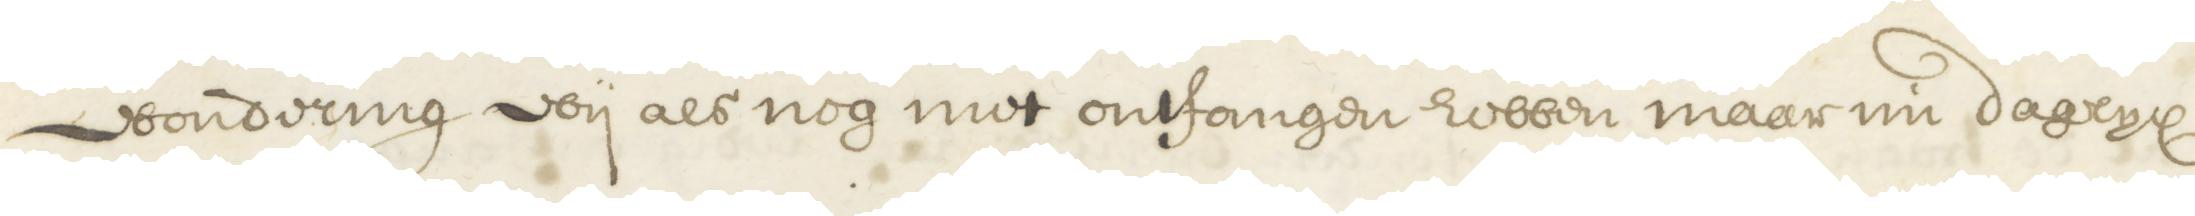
„wondering wij als nog niet ontfangen hebben maar nu dagelyx
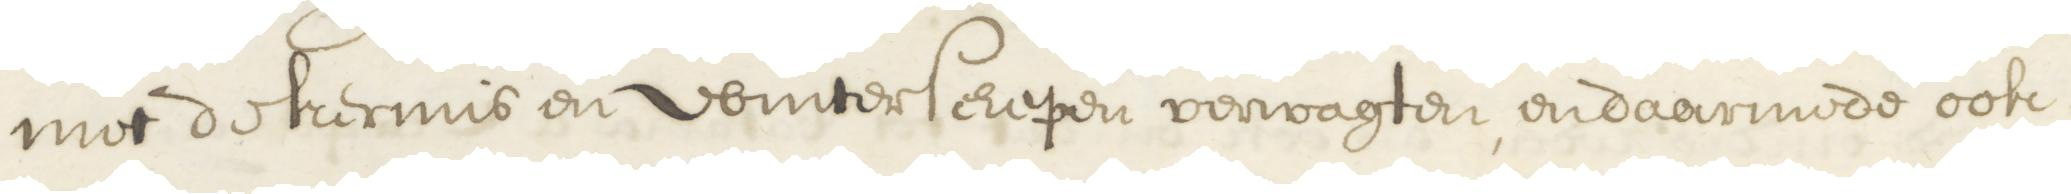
met de kermis en winterschepen verwagten, en daarmede ook
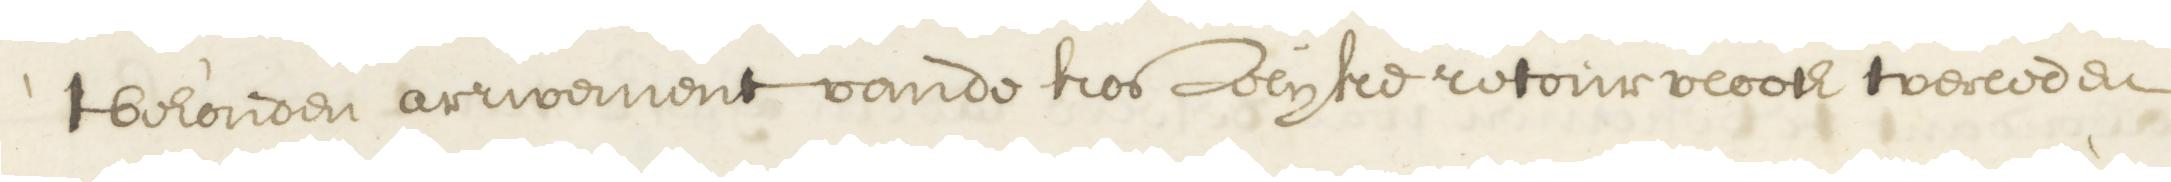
’tbehouden arrivement vande kostelijke retour vlooth 'tverleden
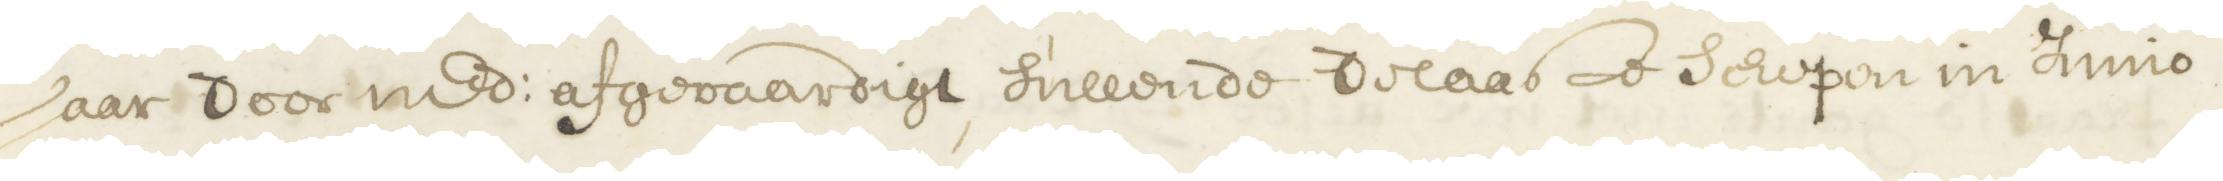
jaar door uEd: afgevaardigt, sullende delaaste schepen in Iunio
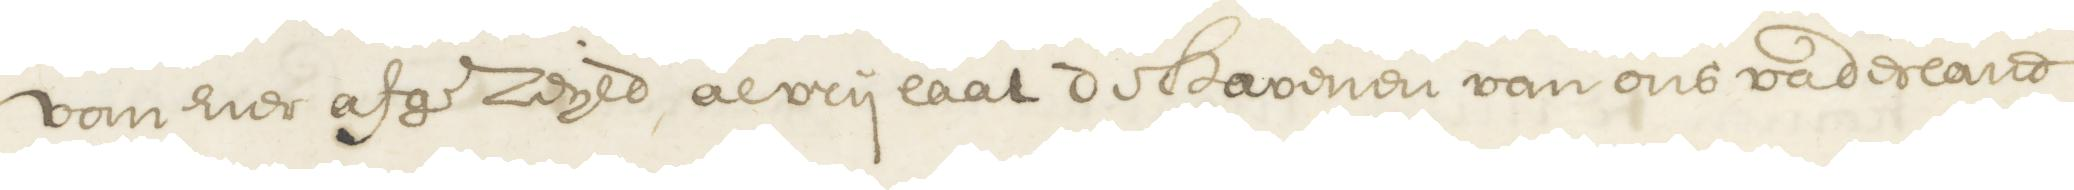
van hier afgezeijld, alvrij laat de havenen van ons vaderland
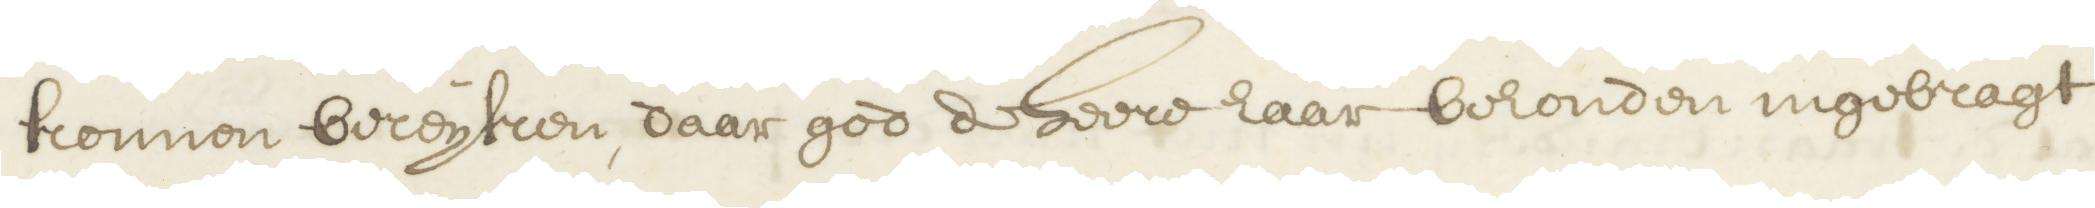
konnen bereijken, daar god de heere haar behouden ingebragt
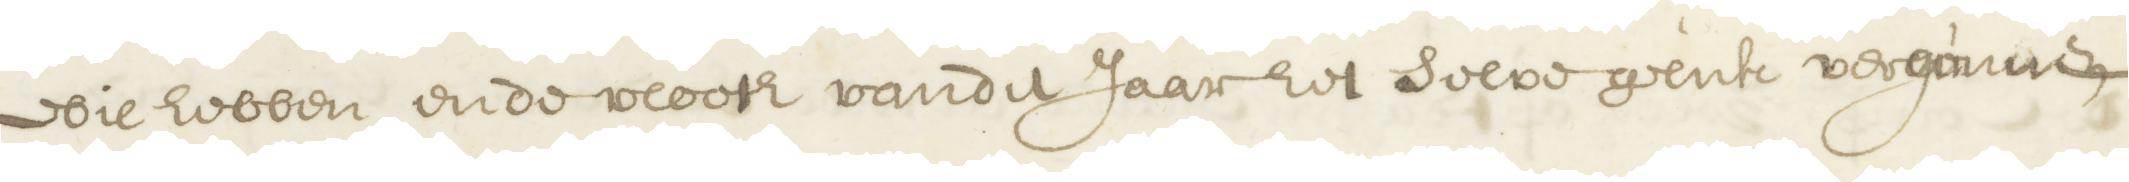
wil hebben, en de vlooth van dit Jaar het selve geluk vergunnen
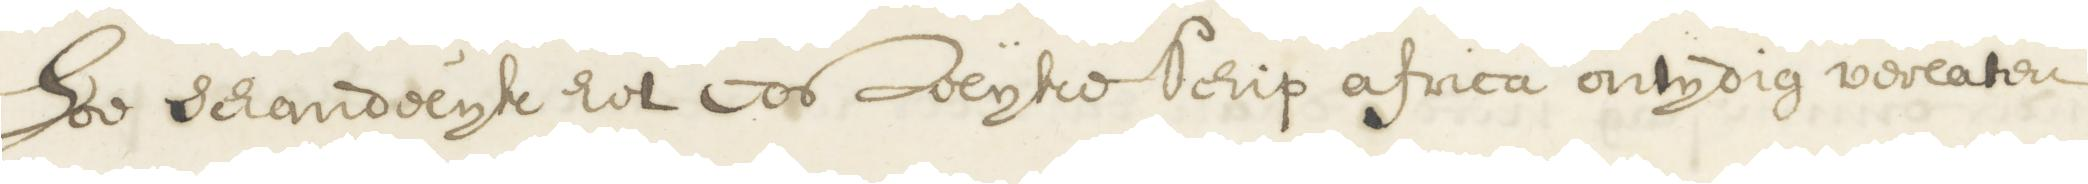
hoe schandelijk het costelijke schip africa ontijdig verlaten
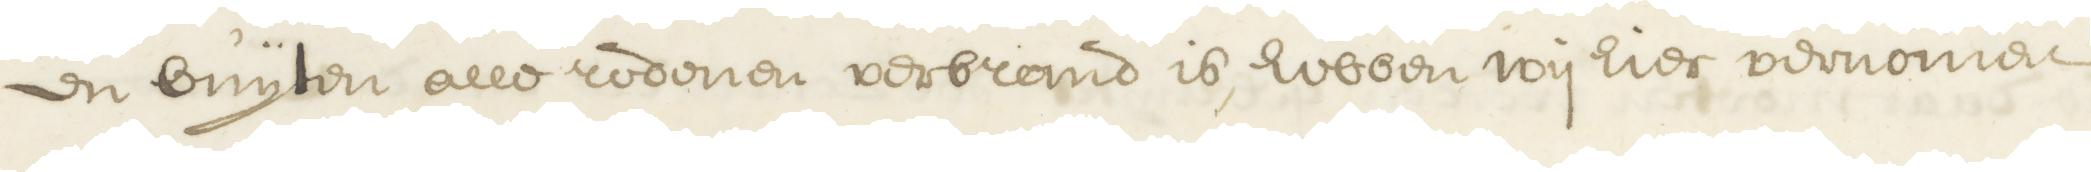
en buijten alle redenen verbrand is, hebben wij hier vernomen
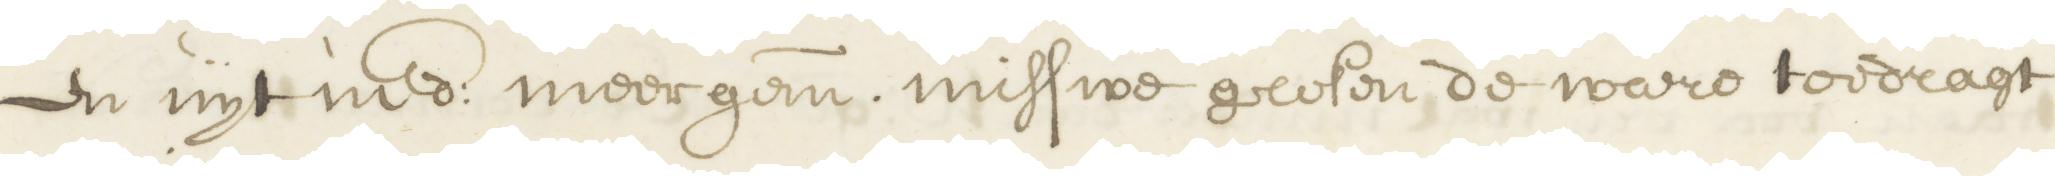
en uijt uEd: meer gem. missive gelesen de ware toedragt
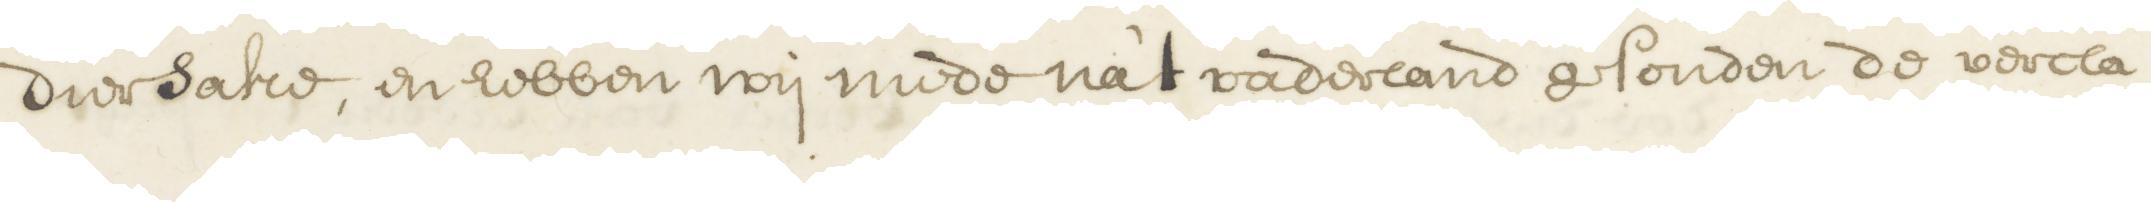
diersake, en hebben wij mede na 't vaderland gesonden de vercla
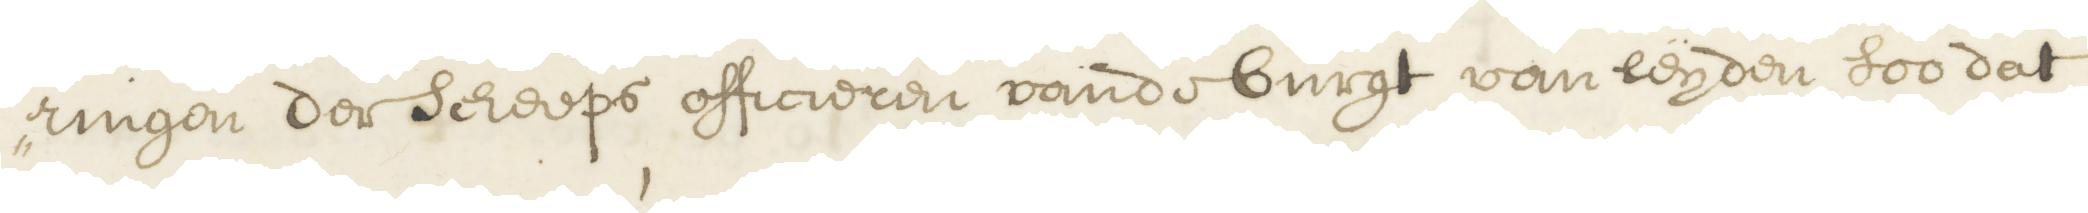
„ringen der scheeps officieren vande burgt van leijden, soo dat
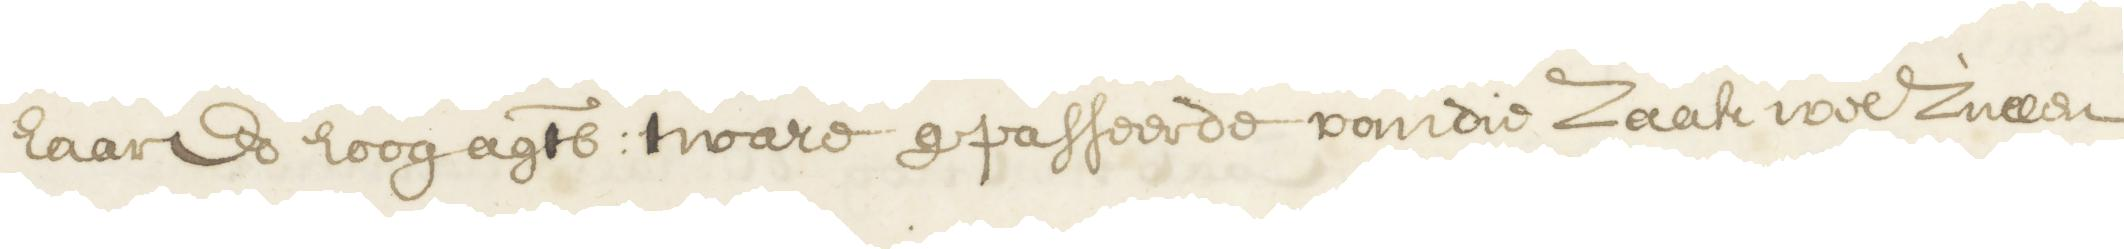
haar Ed hoog agtb: 'tware gepasseerde van die zaak wel zullen
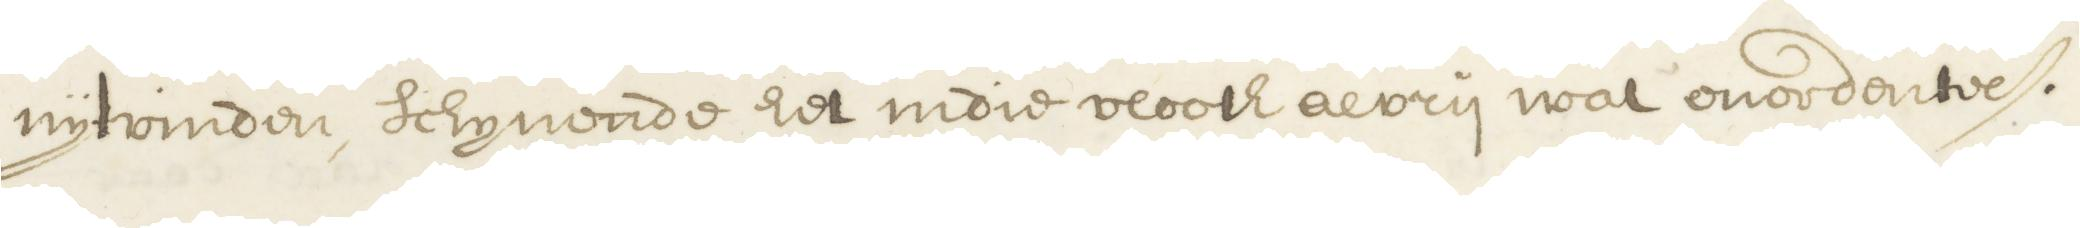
uijtvinden, schynende het in die vlooth alvrij wat onordentelijk
